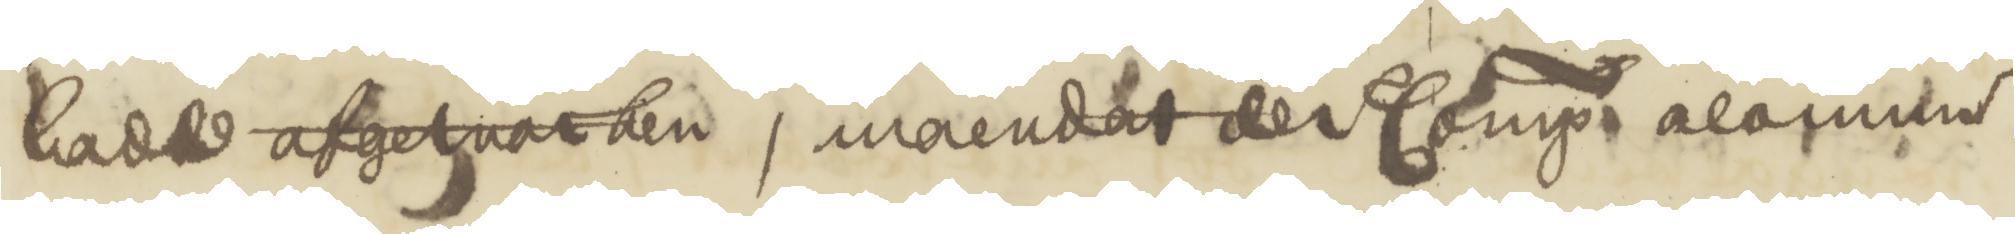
hadde afgetrocken, maerdat deEComp:s alomme
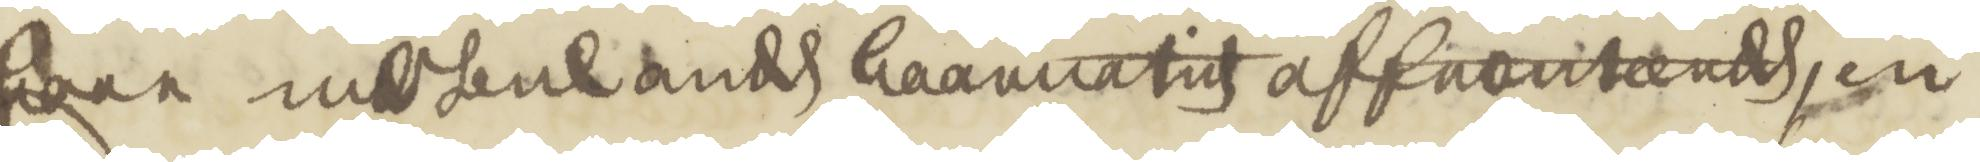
haar indesenlanden haarnatien affronteerden, en
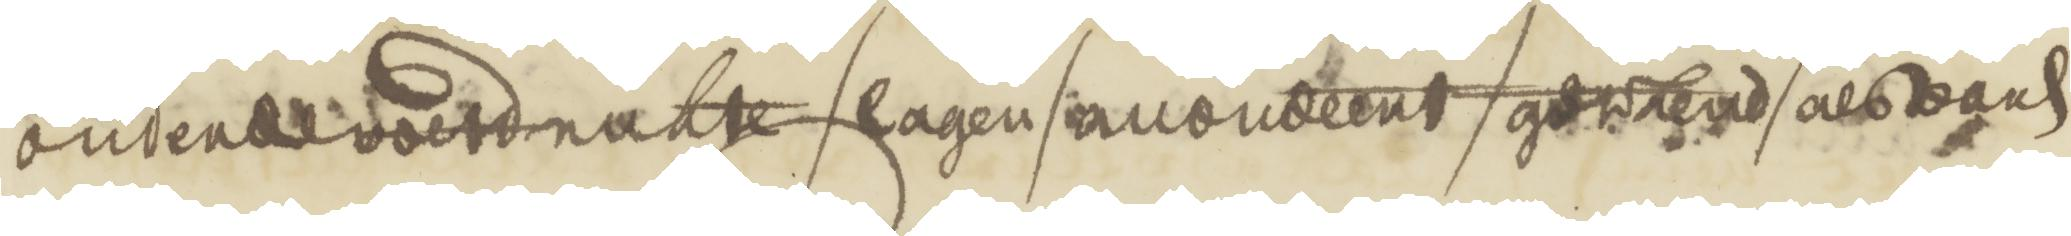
onder de voetdrukte /lager/ accordeert /getekend/ als voren
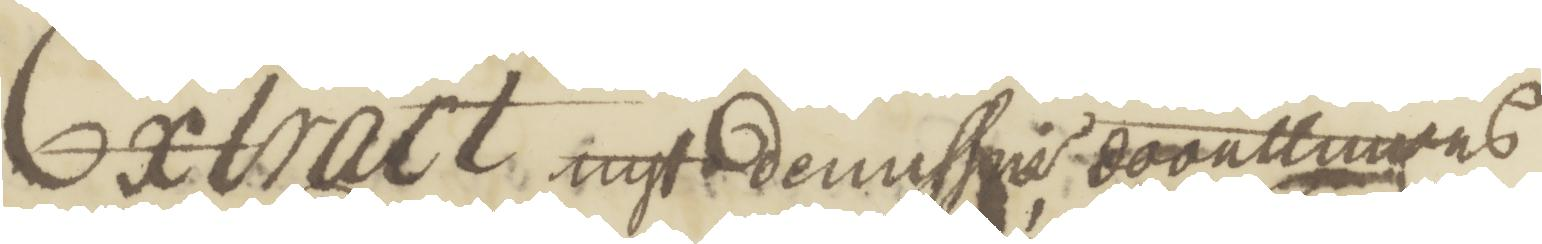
Extract uyt de missive door'ttimors
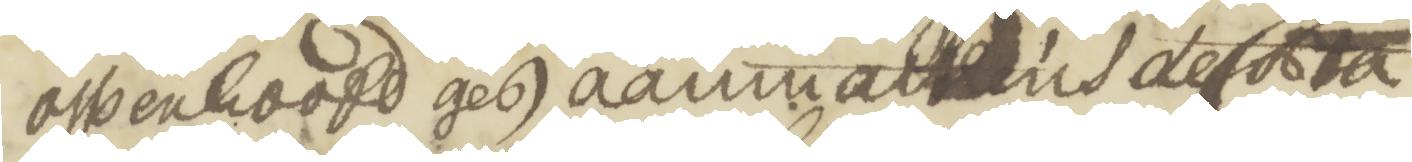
opperhoofd gesz aanmatheus de costa
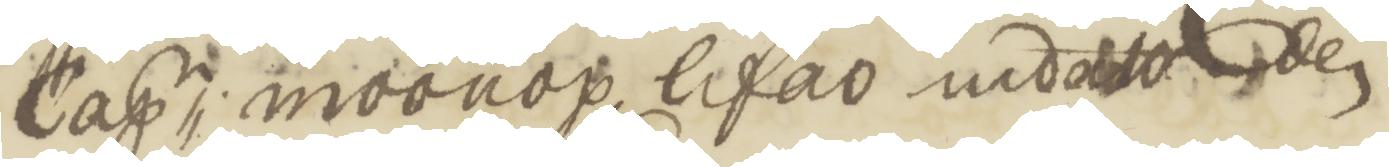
Cap„r moor op. lifao indato den
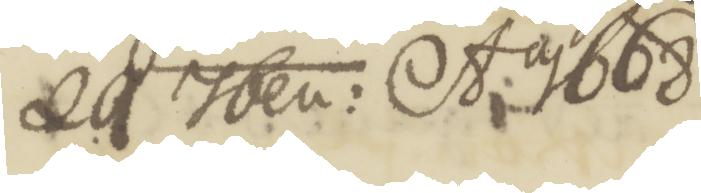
24 7ber: A:o 1668
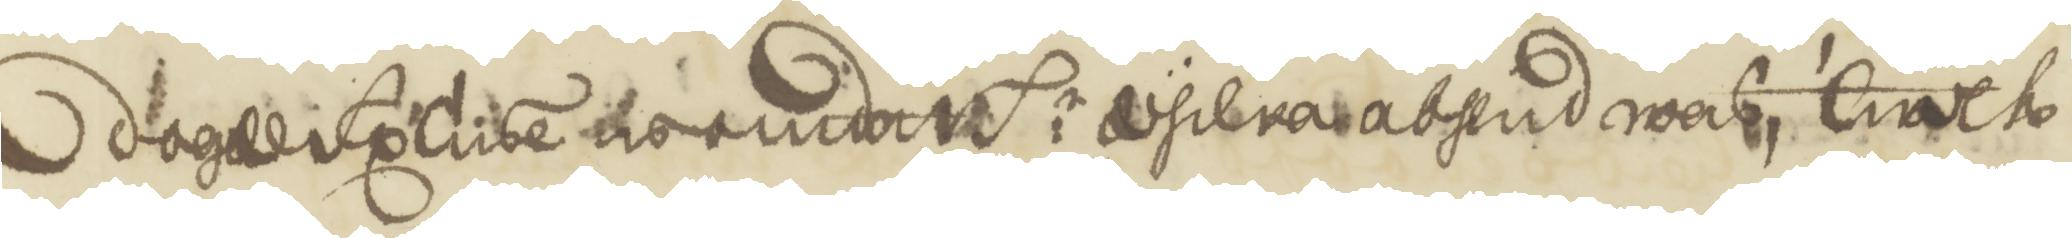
dogdeExcuse vandatS:r de silva absend was, 'twelk
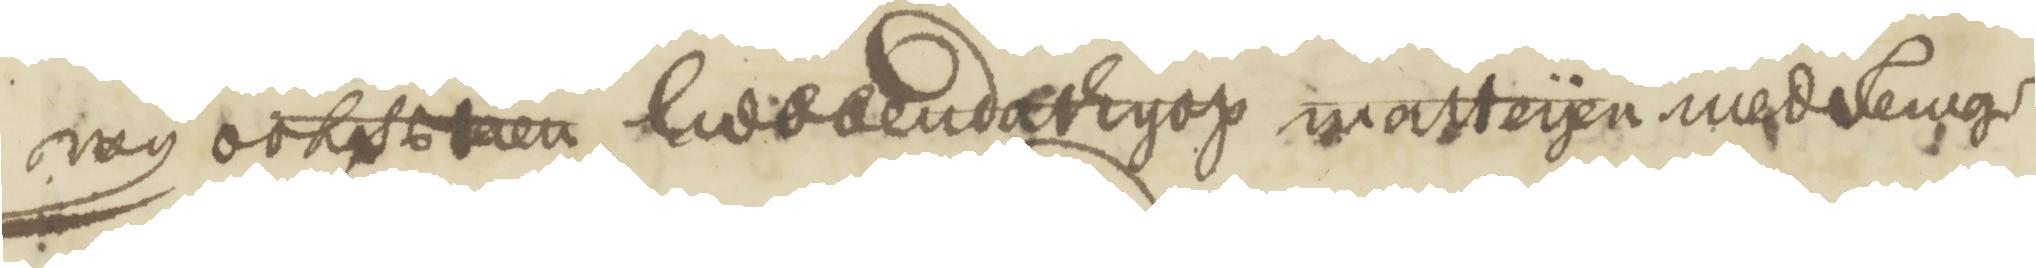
wy ookverstaen hebbendathyop matteijen medEenige
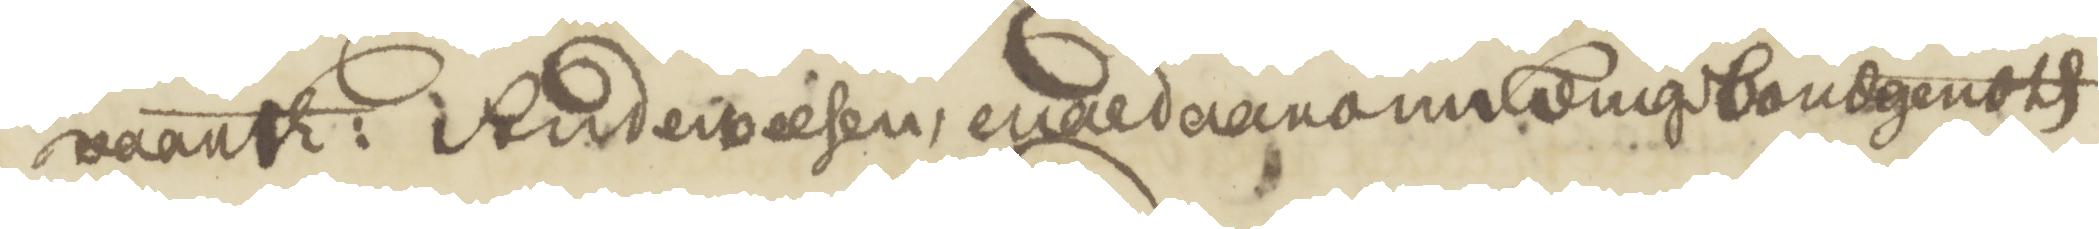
vaarth: Endeweesen, enaldaaromEenigebondgenoten
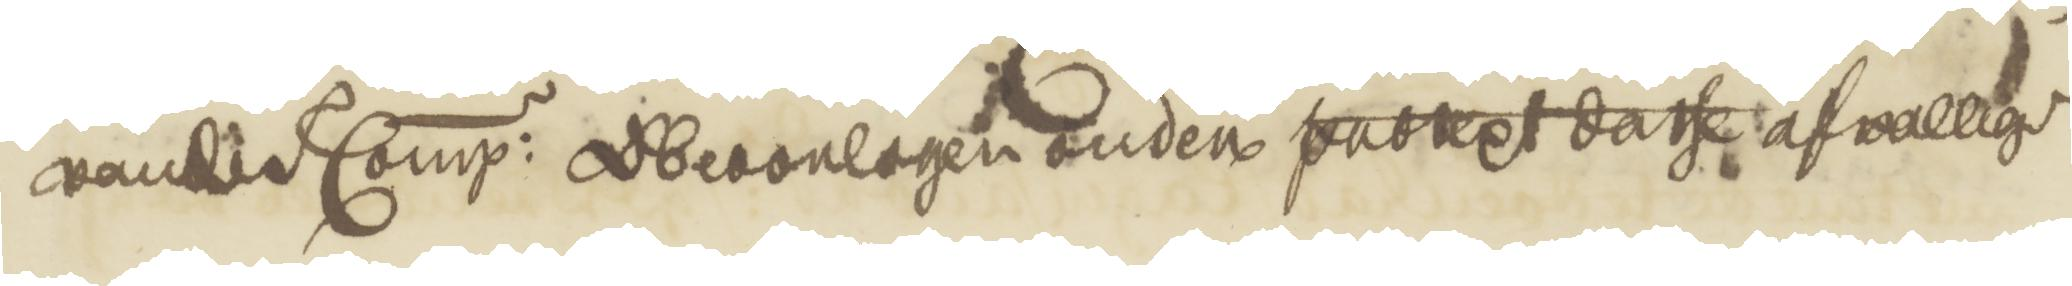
vandeEComp: tebeoorlogen onder pretext datse afvallige
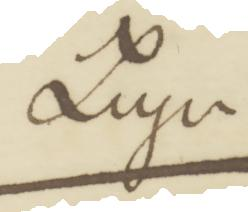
zyn
